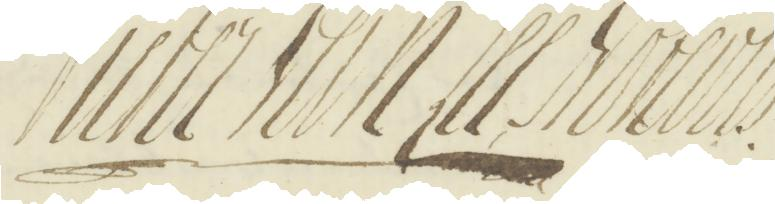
Pieter van Lèe Notaris
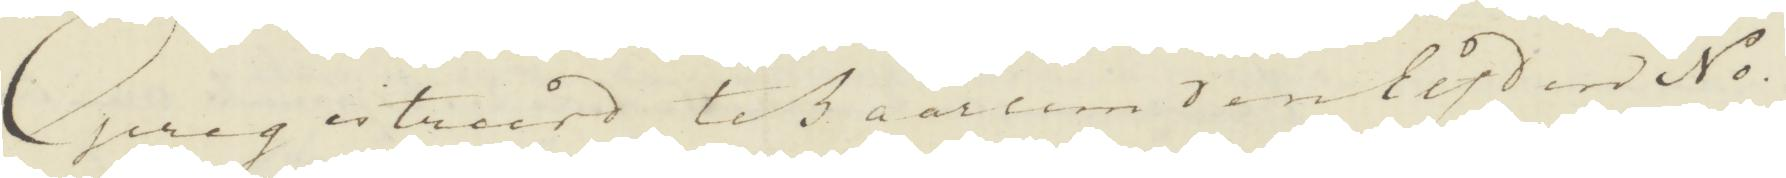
Geregistreerd te Haarlem den Elfden No.
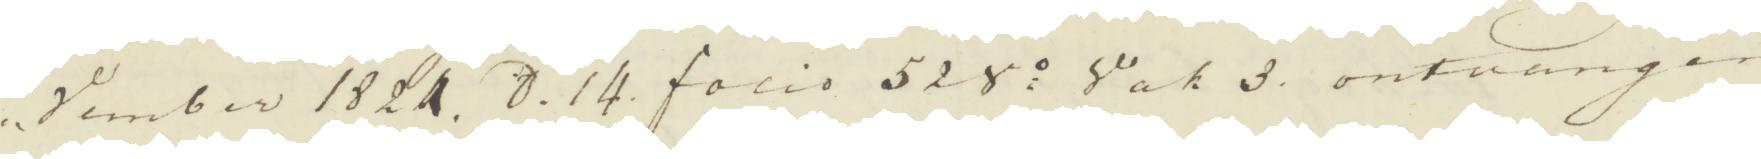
„vember 1824. d.14. folio 52 V:o Vak 3. ontvangen
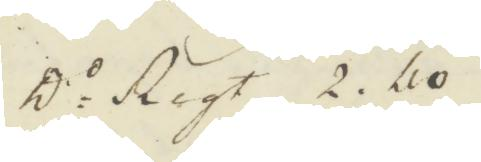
D:o Regt 2.40
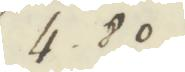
ƒ4.20
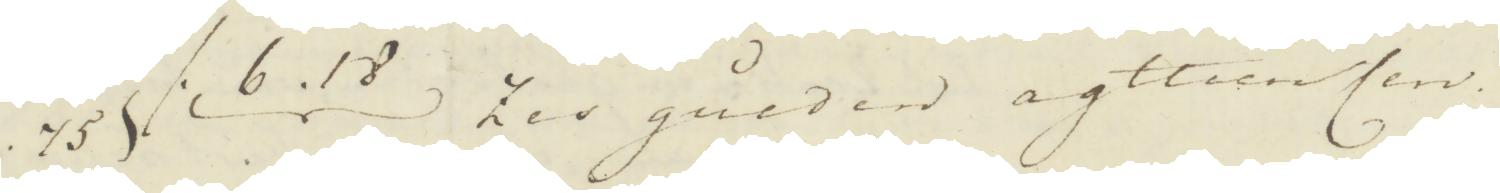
75 St 6.18 zes gulden agttien Cen:
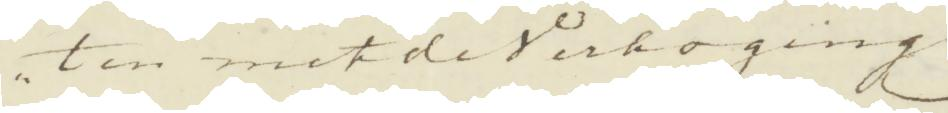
„ten met de Verhogingen
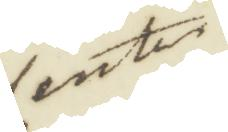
tig Centen
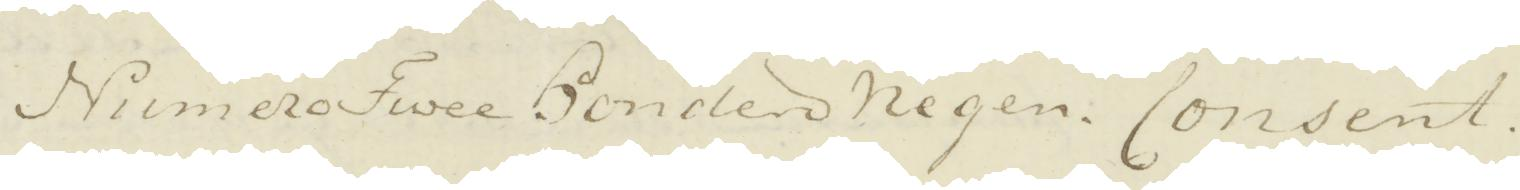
Numero Twee honderd Negen: Consent.
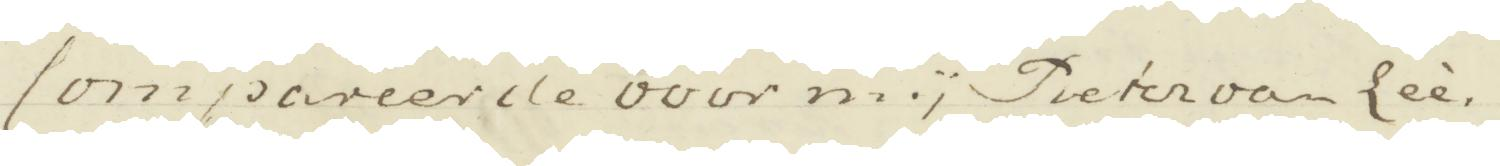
Compareerde voor mij Pieter van Leè,
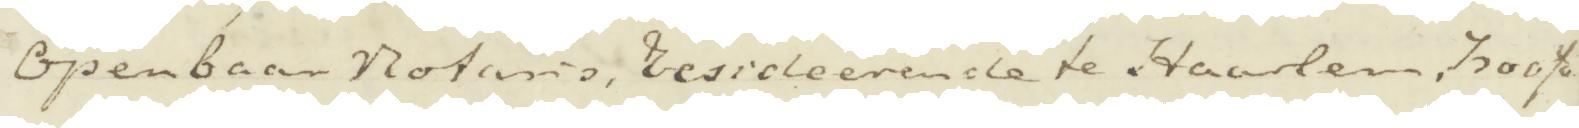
Openbaar Notaris, resideerende te Haarlem, Hoof
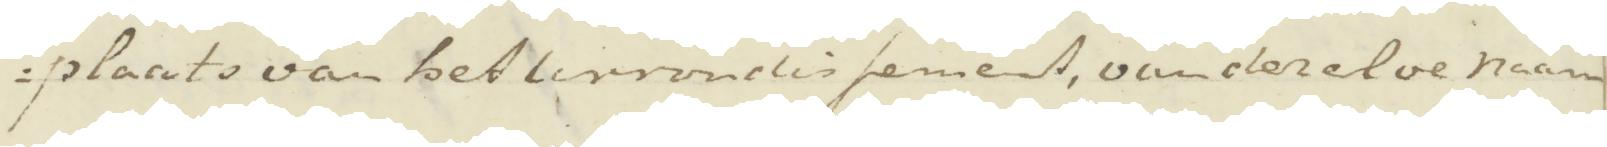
=plaats van het arrondissement, van dezelve naam
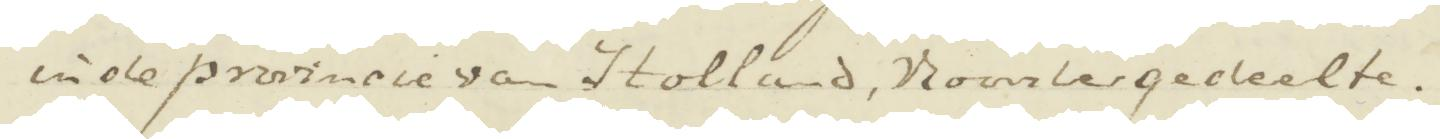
in de provincie van Holland, Noordergedeelte.
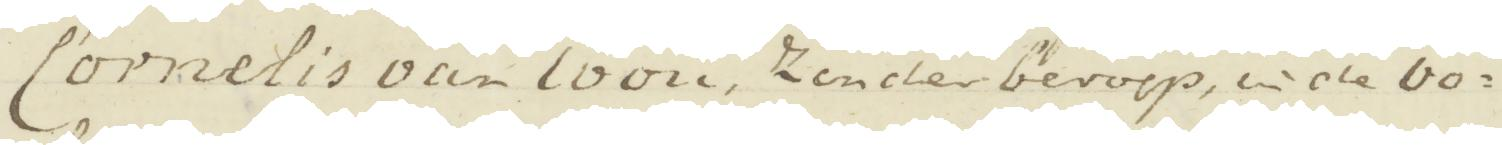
Cornelis van loon, zonder beroep, in de vo=
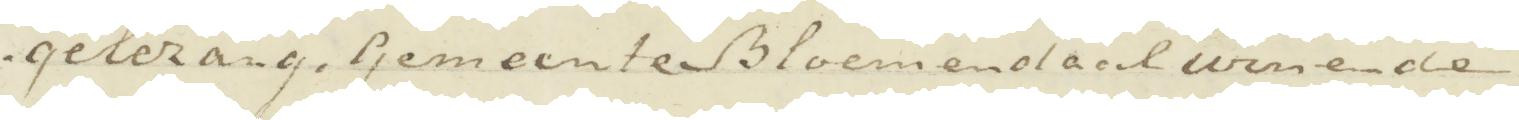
gelezang, Gemeente Bloemendaal wonende
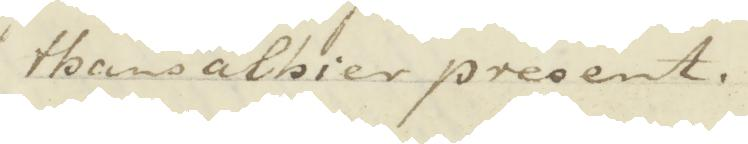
thans alhier present.
